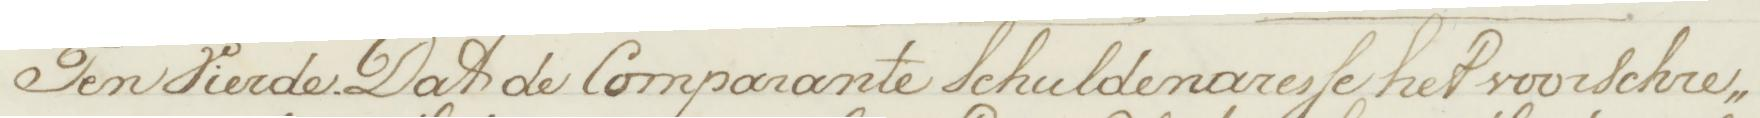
Ten Vierde. Dat de Comparante Schuldenaresse het voorschre„
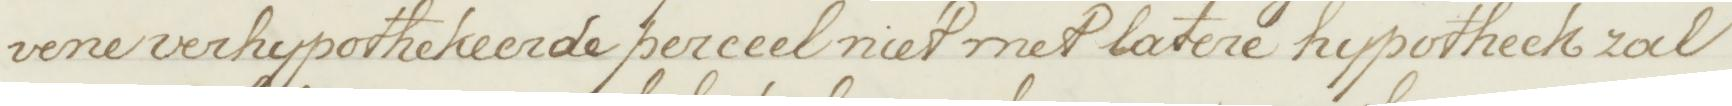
vene verhypothekeerde perceel niet met latere hypotheek zal
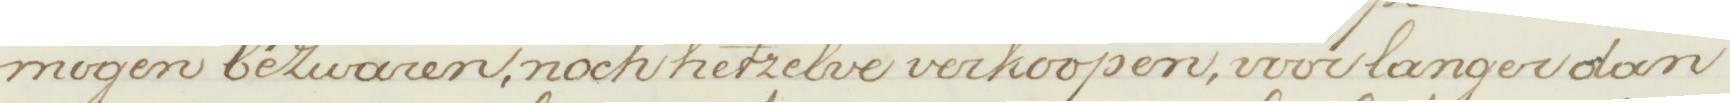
mogen bezwaren, noch hetzelve verkoopen, voor langer dan
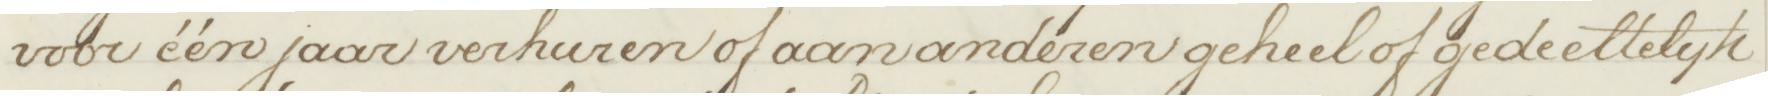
voor één jaar verhuren of aan anderen geheel of gedeeltelyk
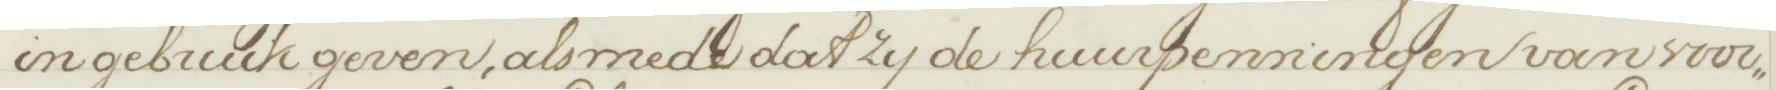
ingebruik geven, alsmede dat zy de huurpenningen van voor„
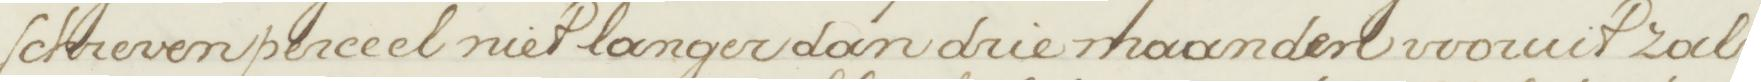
schreven perceel niet langer dan drie maanden vooruit zal
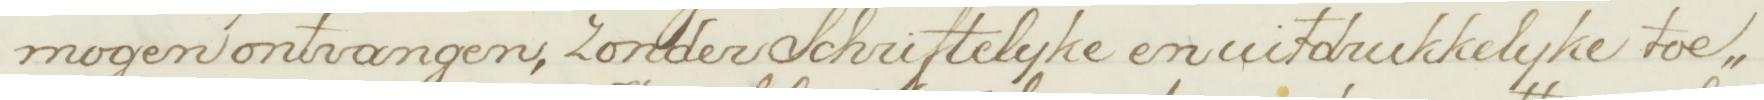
mogen ontvangen, zonder schriftelyke en uitdrukkelyke toe„
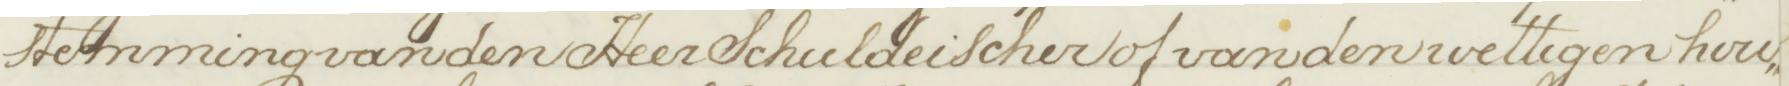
stemming van den Heer Schuldeischer of van den wettigen hou„
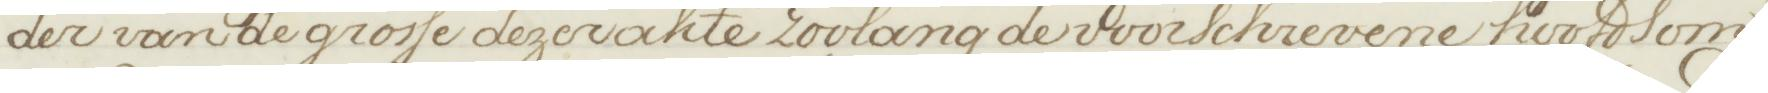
der van de grosse dezer akte zoolang de voorschrevene hoofdsom
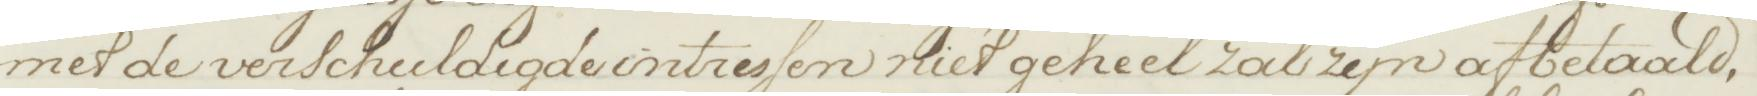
met de verschuldigde intressen niet geheel zal zyn afbetaald,
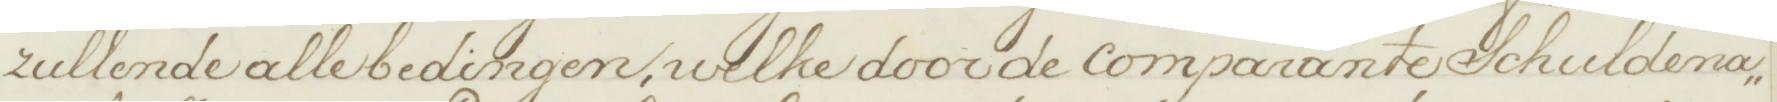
zullende alle bedingen, welke door de comparante Schuldena„
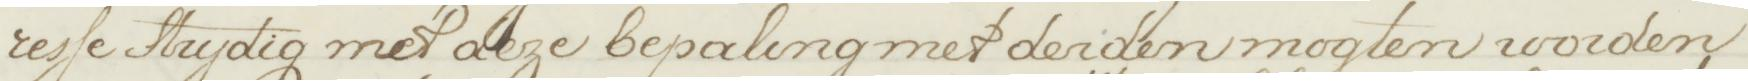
resse strydig met deze bepaling met derden mogten worden
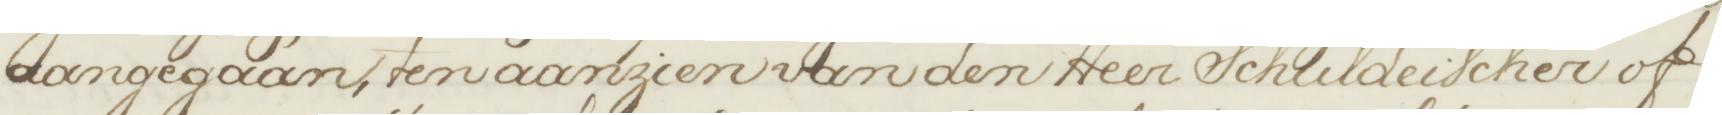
aangegaan, ten aanzien ven den Heer Schuldeischer of
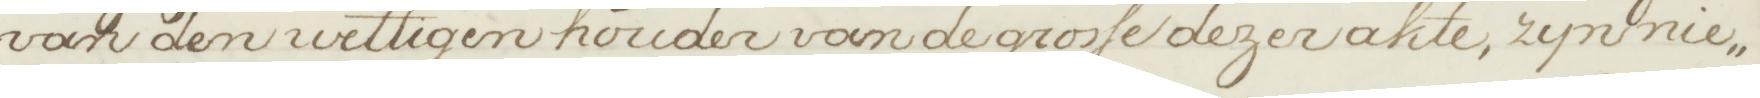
van den wettigen houder van de grosse dezerakte, zyn nie„
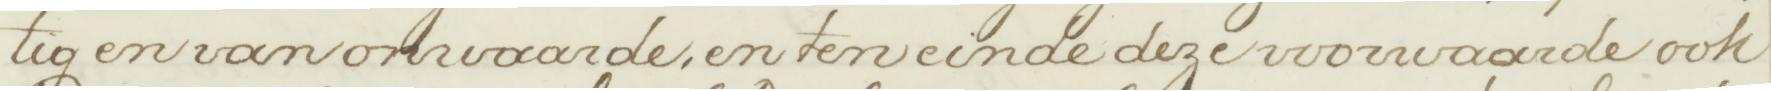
tig en van onwaarde, en ten einde deze voorwaarde ook
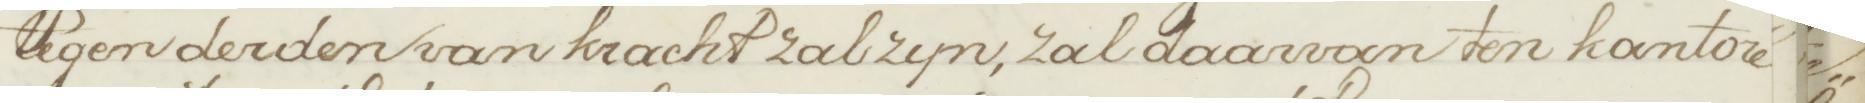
tegen derden van kracht zal zyn, zal daarvan ten kantore
